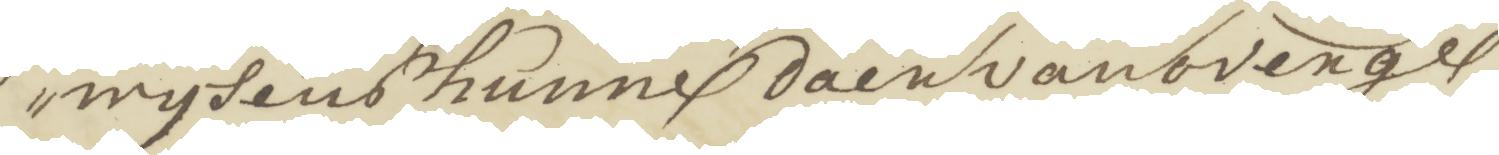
„wijsens hunne daer van overge
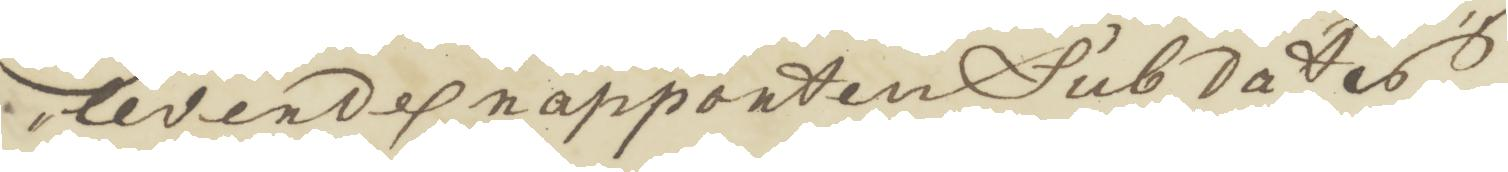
„leverde rapporten Sub datis
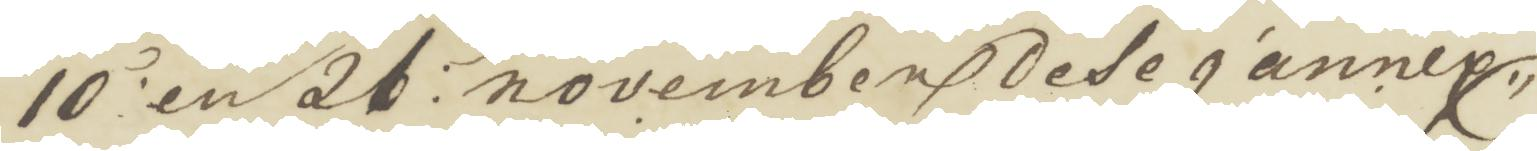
10:' en 26:' november dese g'annex„
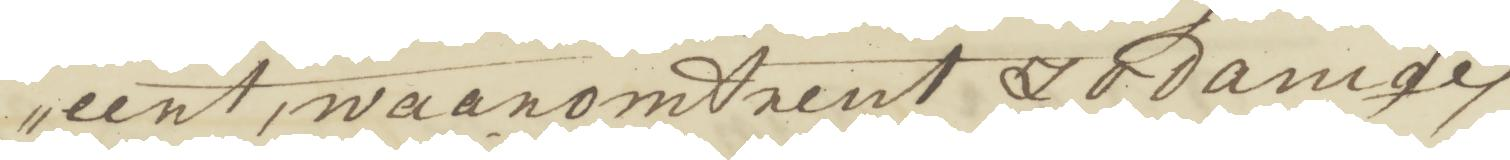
„eert, waar omtrent zodanige
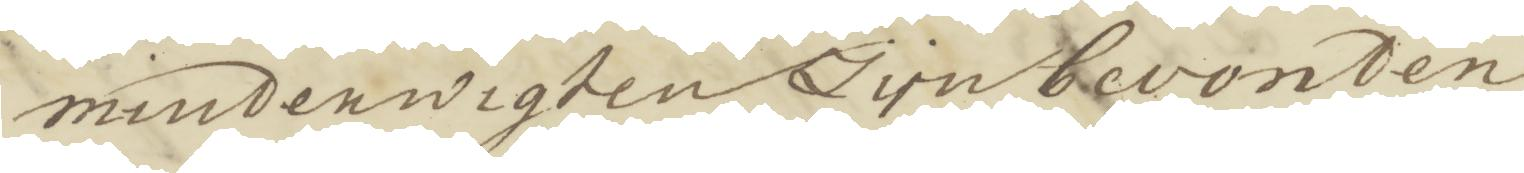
minderwigten zijn bevonden
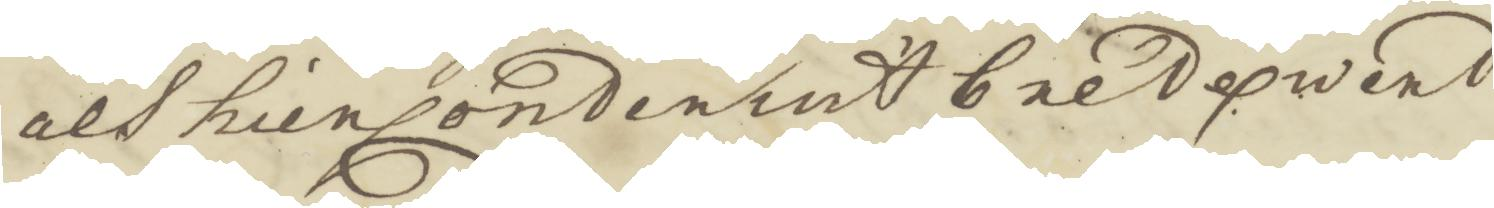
als hier onder in't brede werd
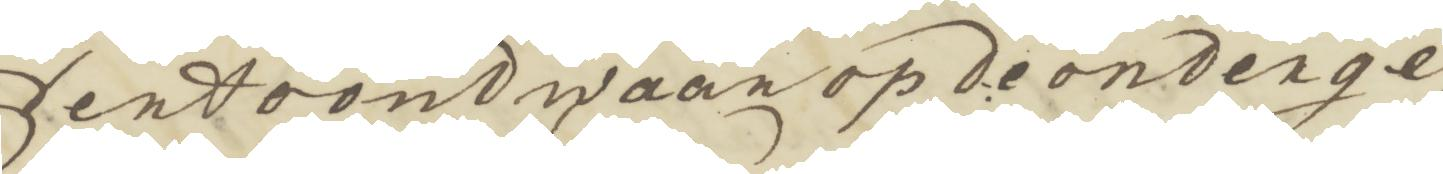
Vertoond waar op de onderge
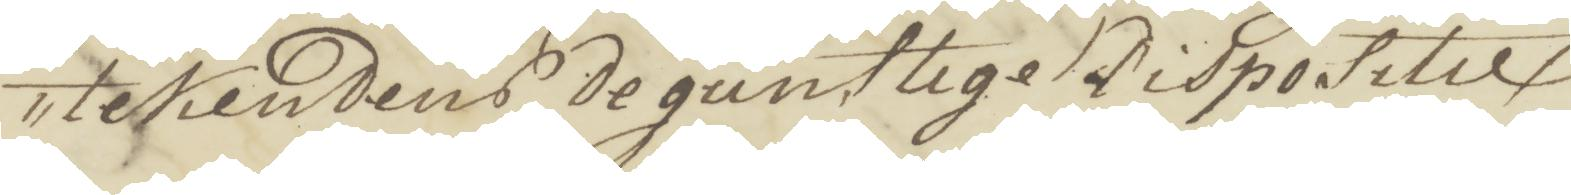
„tekendens de gunstige Dispositie
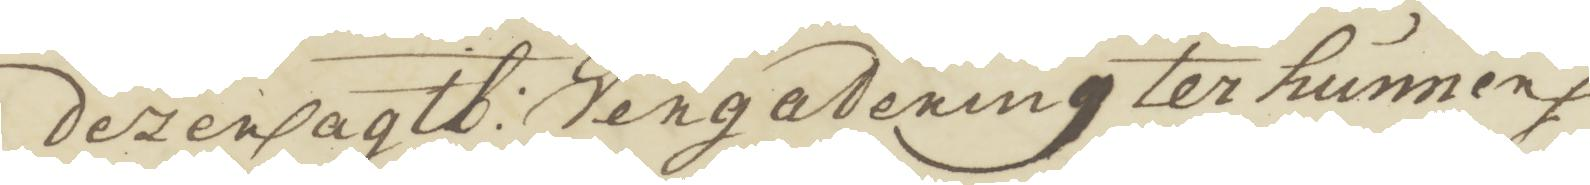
dezer agtb: Vergadering ter hunner
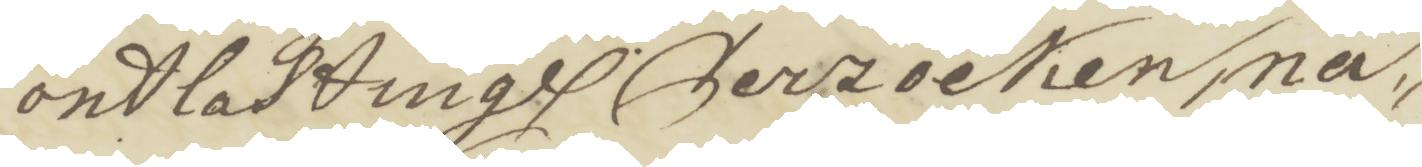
ontlastinge verzoeken, na„
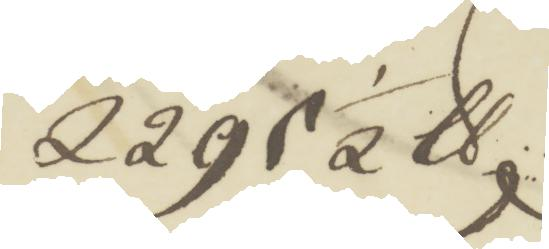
2295 ½ lb
